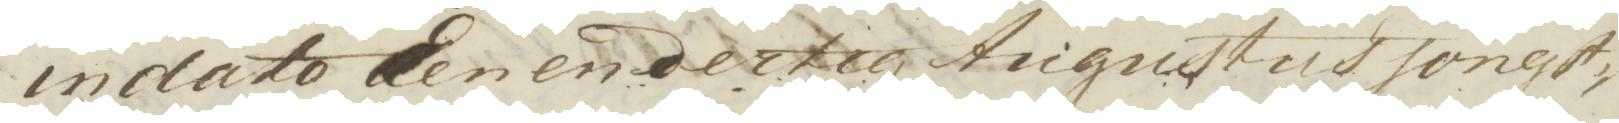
in dato Een en dertig Augustus jongst„
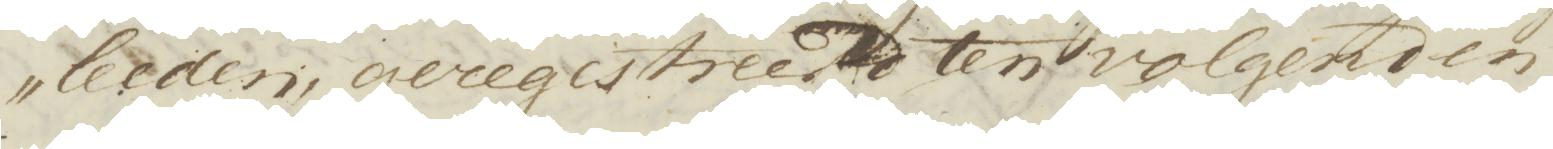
„leeden, geregistreed ten volgenden
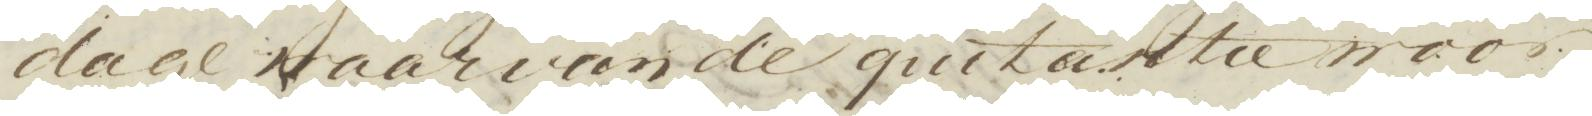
dage waarvan de quitantie woor„
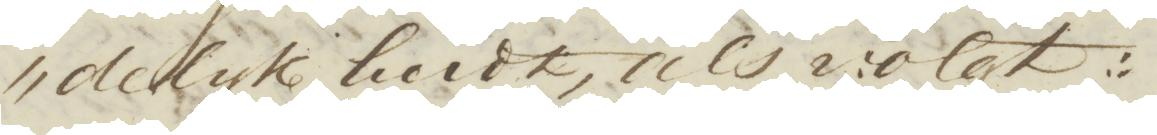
„delyk luidt, als volgt:
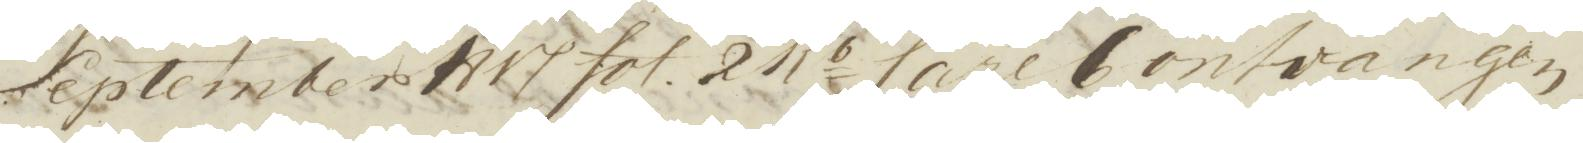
September 1817 fol. 2 R=o Caze 6 ontvangen
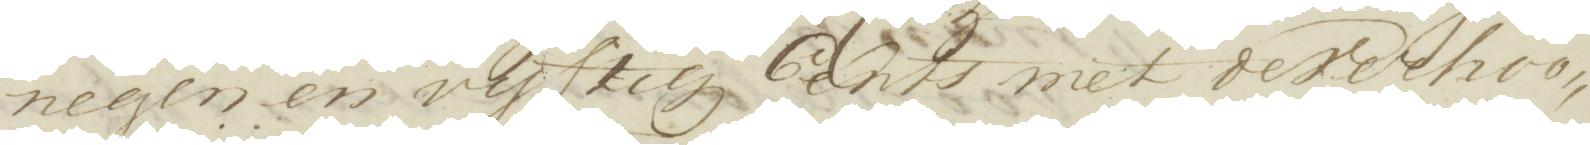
negen en vyftig cents met de verhoo„
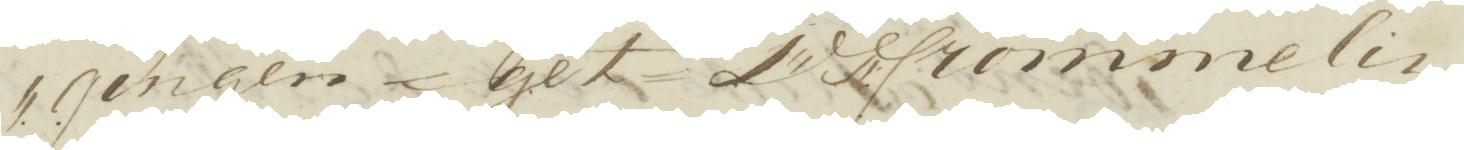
„gingen = get = DF Crommelin
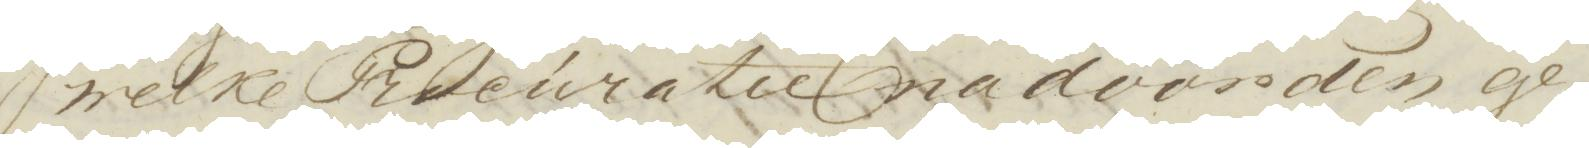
welke Procuratie na door den ge
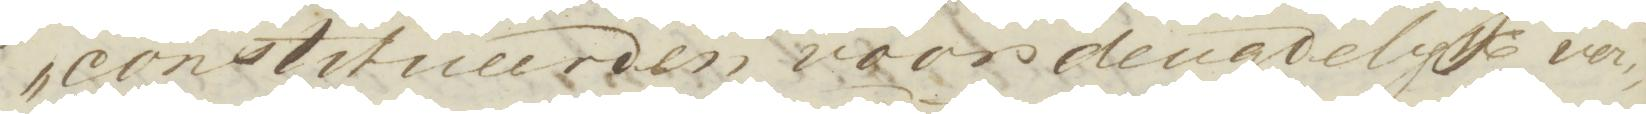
„constitueerden voor deugdelyk ver„
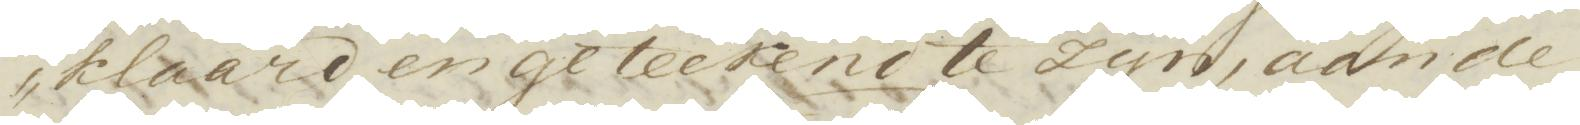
„klaard en geteekend te zyn, aan de
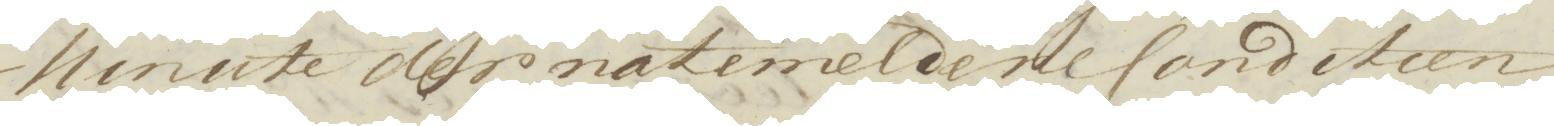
Minute der natemeldene Conditien
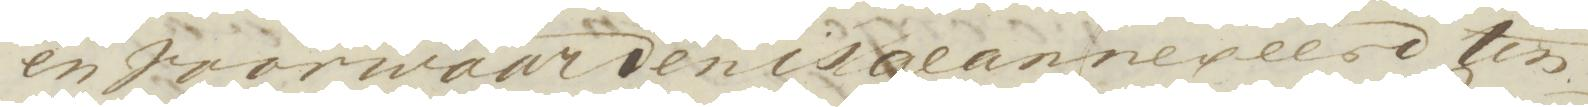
en voorwaarden is geannexeerd ten
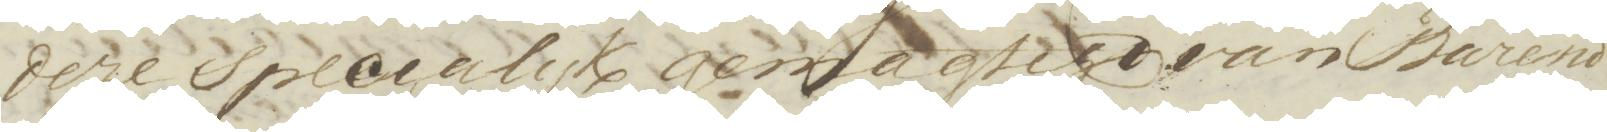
deze specialyk gemagtigd van Barend
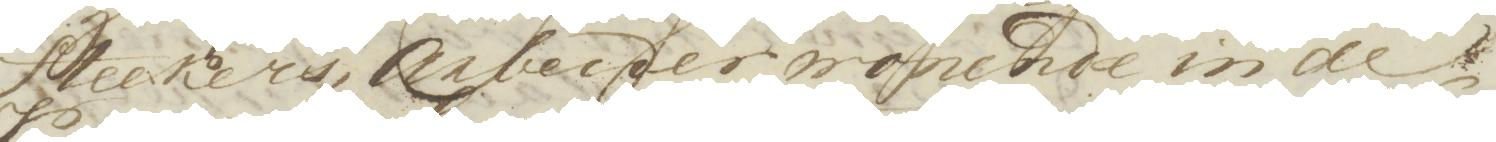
Steekers, Arbeider wonende in de
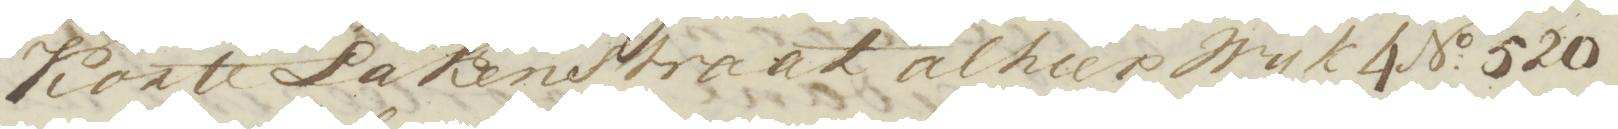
Korte Lakenstraat alhier Wyk 4 N:o 520.
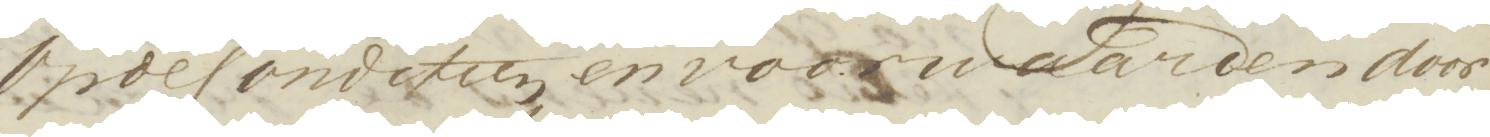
op de Conditien en voorwaarden door
